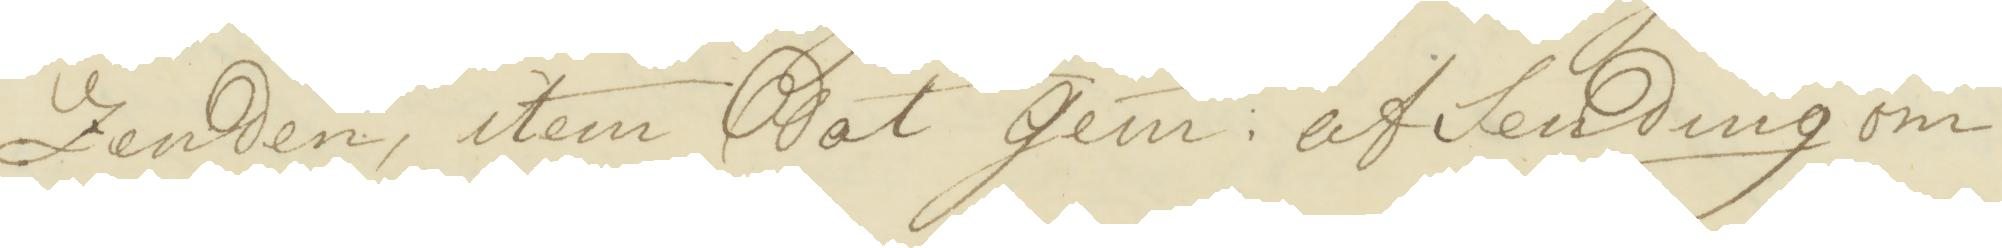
Zenden, item dat gem: afsending om
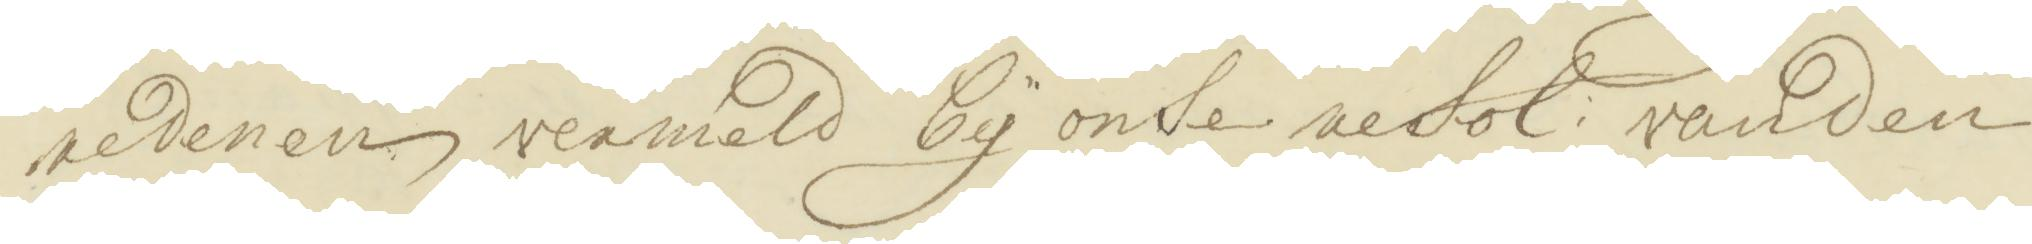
redenen vermeld bij onse resol: van den
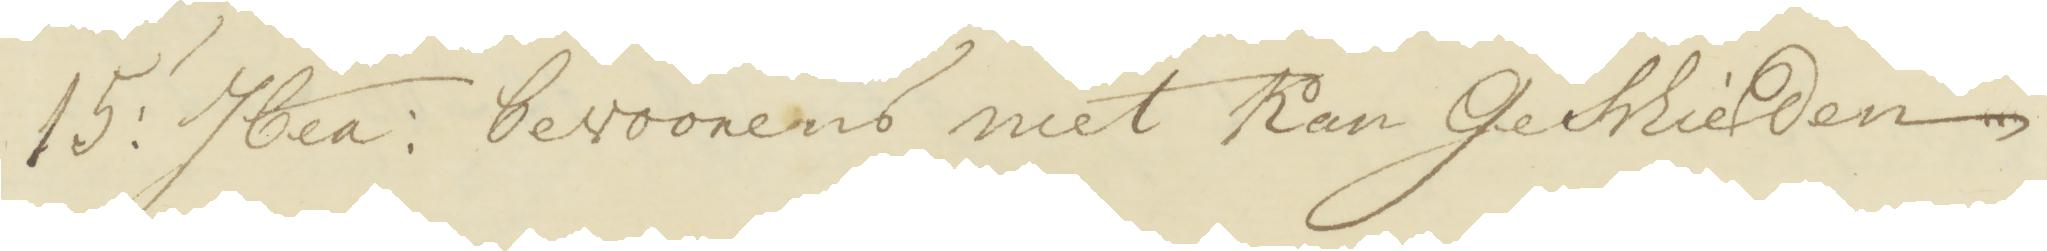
15.' 7ber: bevoorens niet Kan geschieden
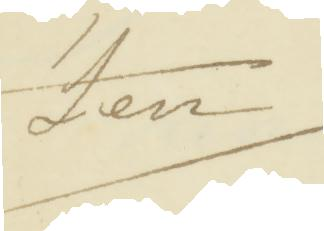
'ten
